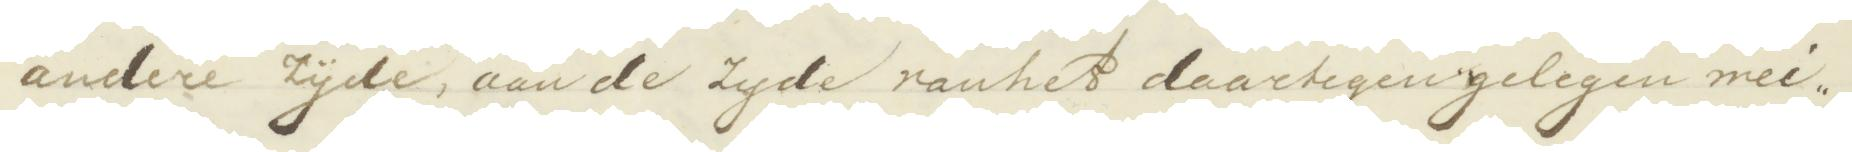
andere zijde, aan de zyde van het daartegengelegen wei„
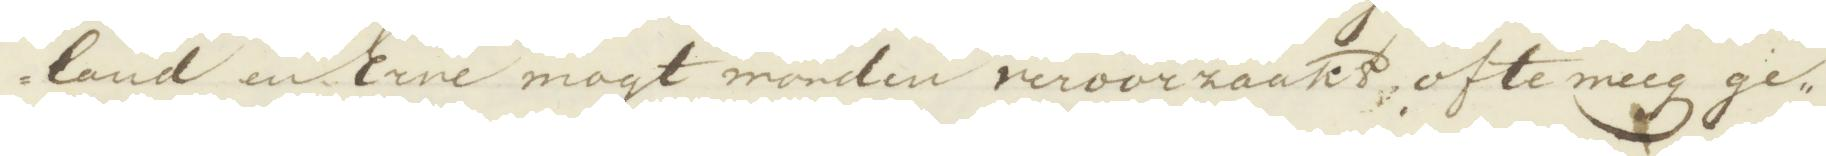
=land en Erve mogt worden veroorzaakt, of te weeg ge„
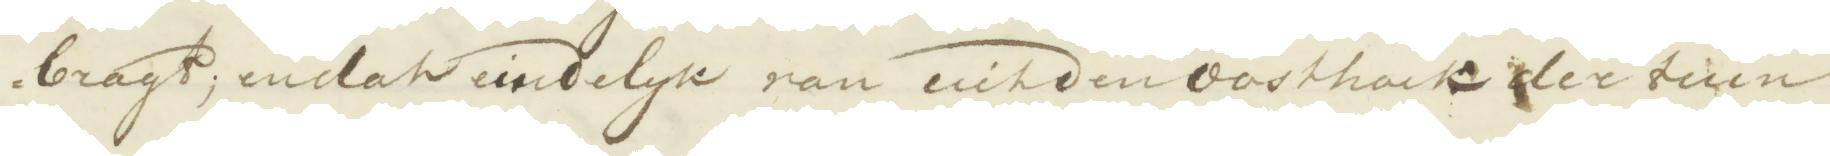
=bragt; en dat eindelyk van uit den Oosthoek der tuin
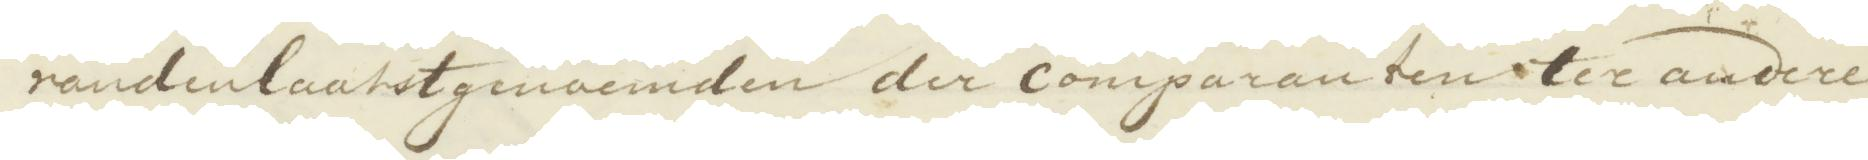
vandenlaatstgenoemden der comparanten ter andere
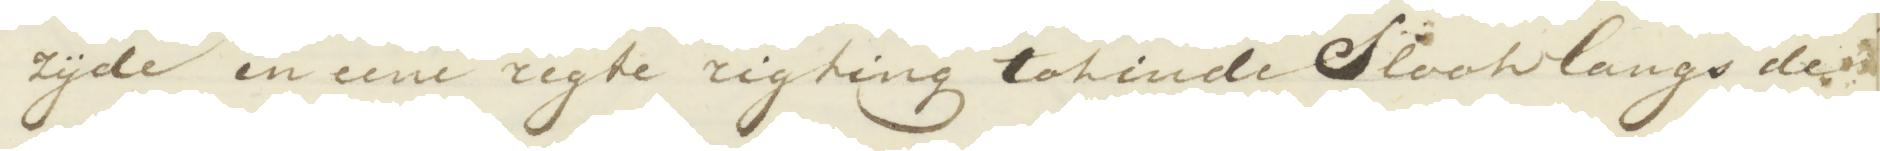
zijde in eene regte rigting tot inde Sloot langs de
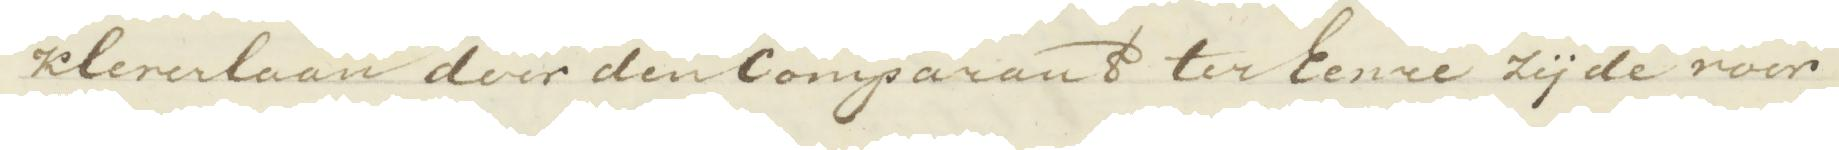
kleverlaan door den Comparant ter Eenre zijde voor
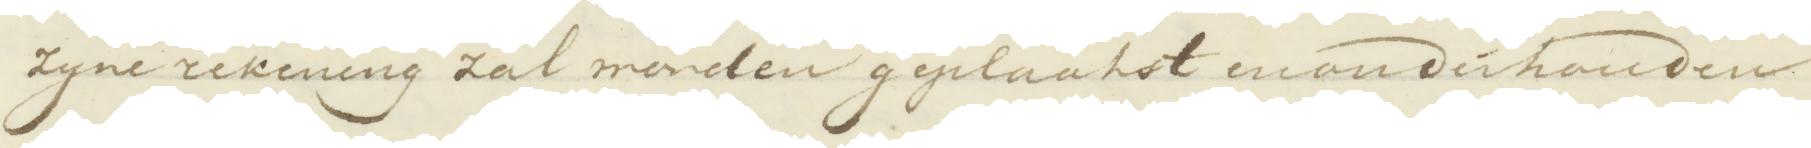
zyne rekening zal worden geplaatst en onderhouden.
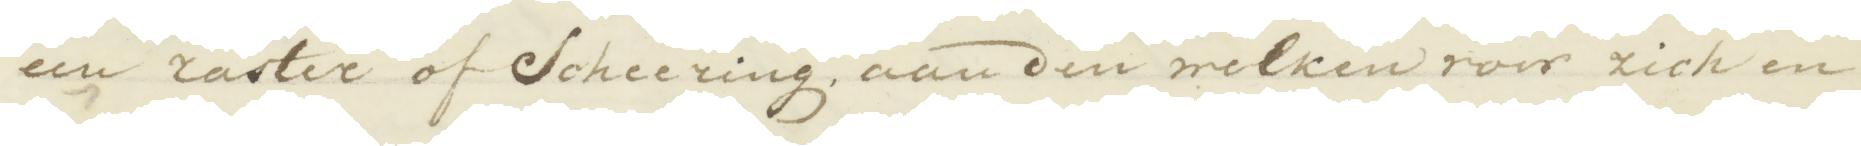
een raster of scheering, aan den welken voor zich en
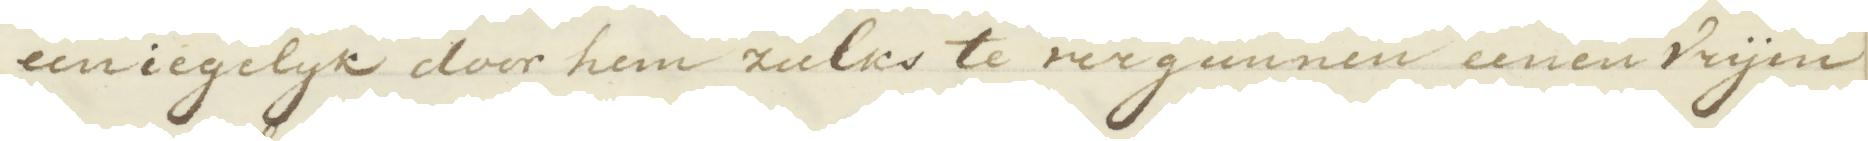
een iegelijk door hem zulks te vergunnen eenen vrijen
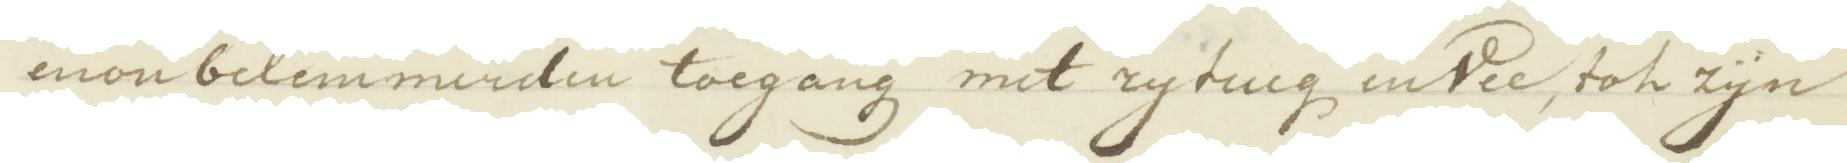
en onbelemmerden toegang met rijtuig en Vee, tot zijn
